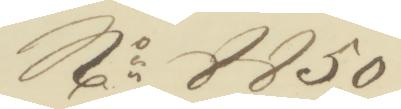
N::o 8850
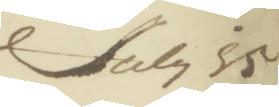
Iuly 15
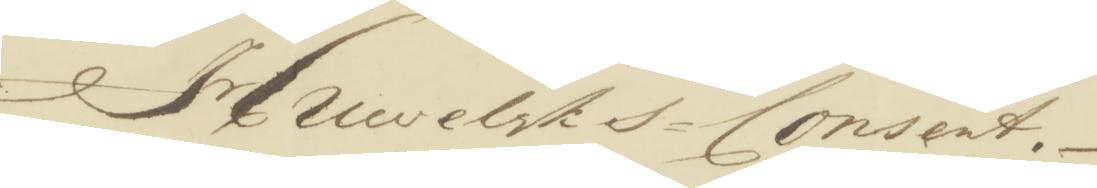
Huwelyks = Consent.
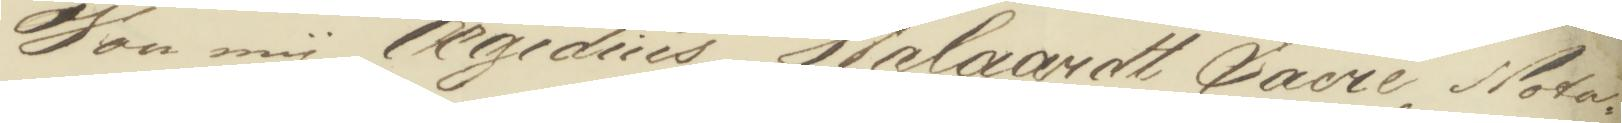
Van mij AEgidius Walaardt Sacré, Nota„
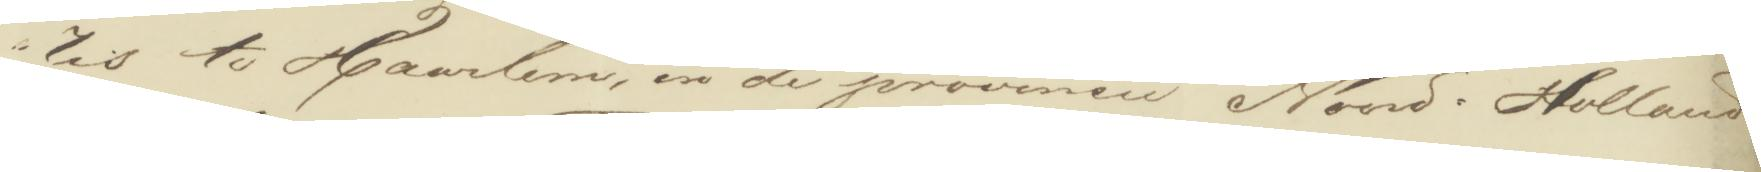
„ris te Haarlem, in de provincie Noord = Holland
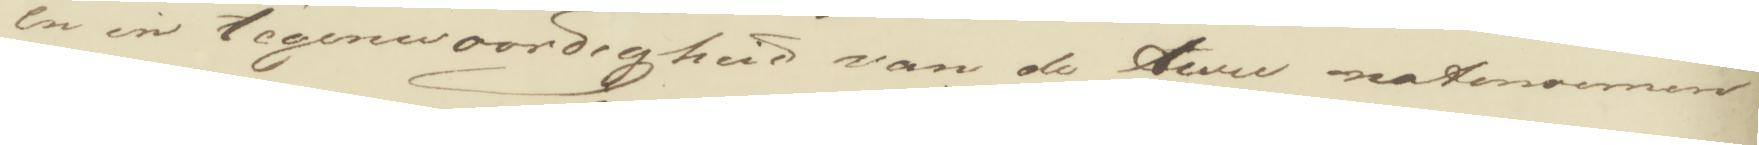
en in tegenwoordigheid van de twee natenoemen
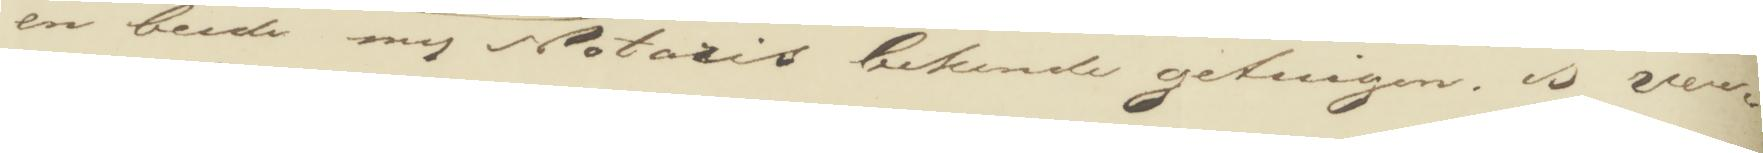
en beide my Notaris bekende getuigen, is ver
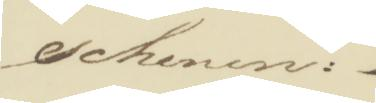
schenen:
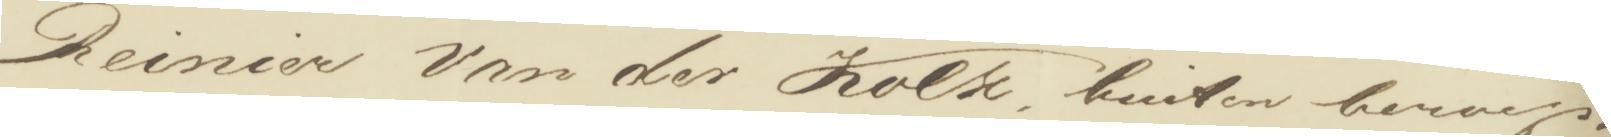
Reinier van der Kolk, buiten beroep,
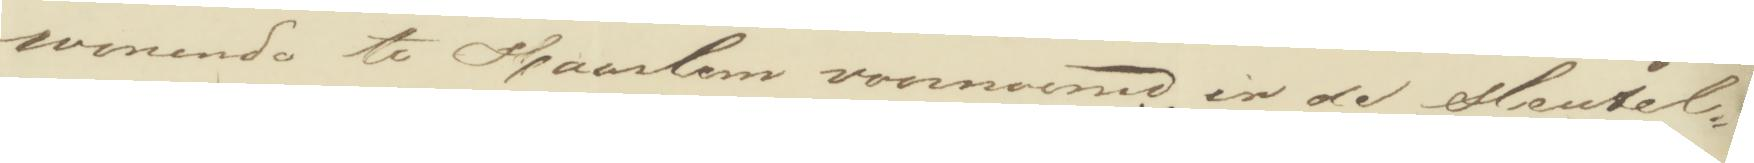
wonende te Haarlem voornoemd, in de Sleutel„
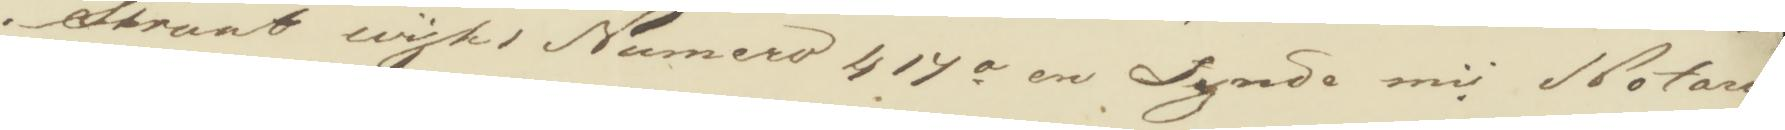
straat wijk 1 Numero 417.a en Zynde mij Notaris
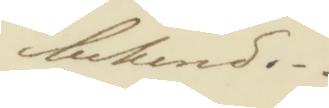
bekend. -
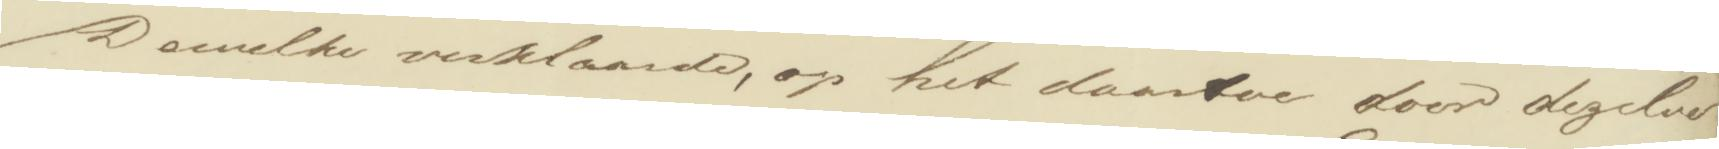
Dewelke verklaarde, op het daartoe door dezelve
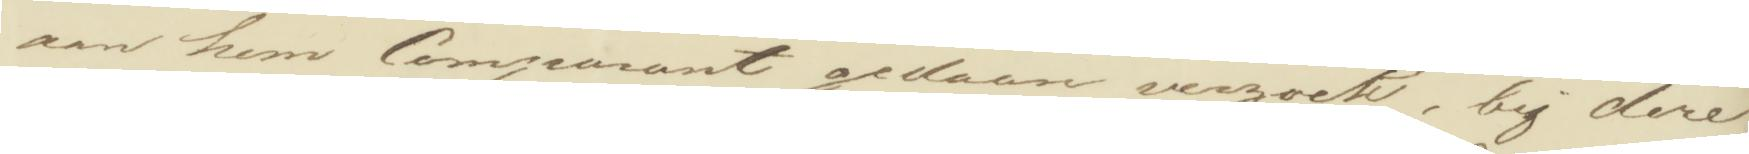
aan hem Comparant gedaan verzoek, bij deze
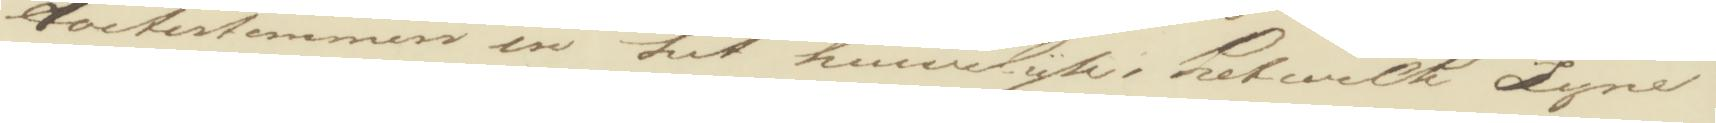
toetestemmen in het huwelijk, hetwelk zyne
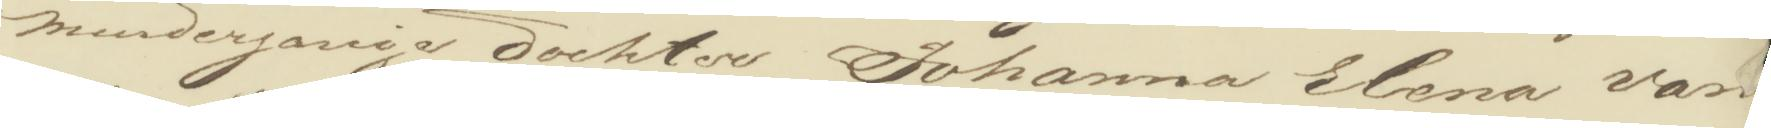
minderjarige dochter Iohanna Elena van
